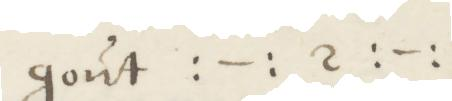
gout : — : 2 : — :
